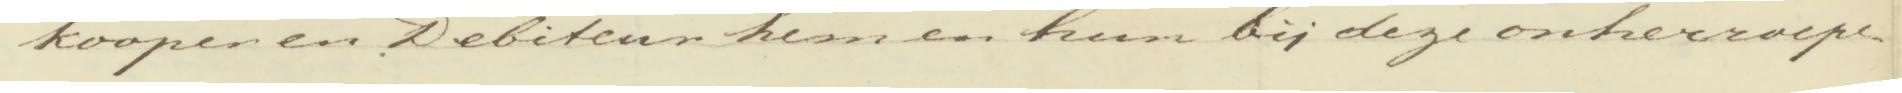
kooper en Debiteur hem en hun bij deze onherroepe
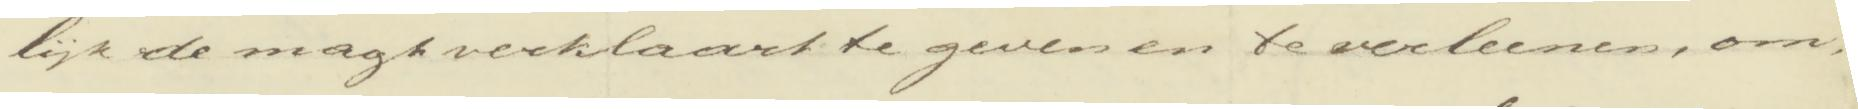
lijk de magt verklaart te geven en te verleenen, om,
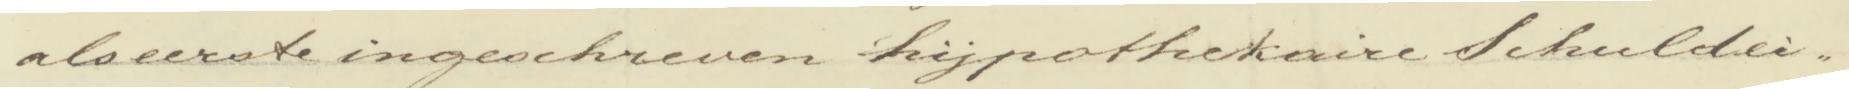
als eerste ingeschreven hijpothekaire Schuldei„
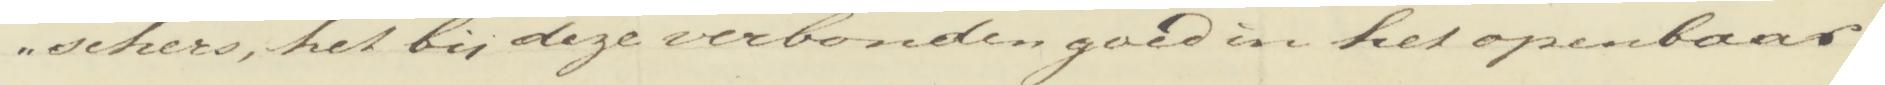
„schers, het bij deze verbonden goed in het openbaar,
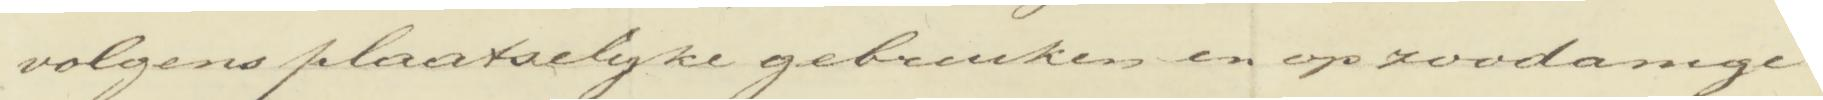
volgens plaatselyke gebruiken en op zoodanige
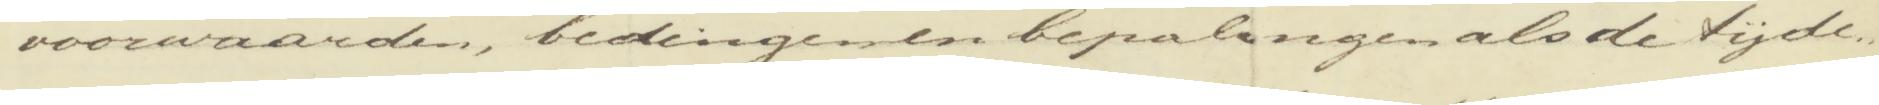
voorwaarden, bedingen en bepalingen als de tijde„
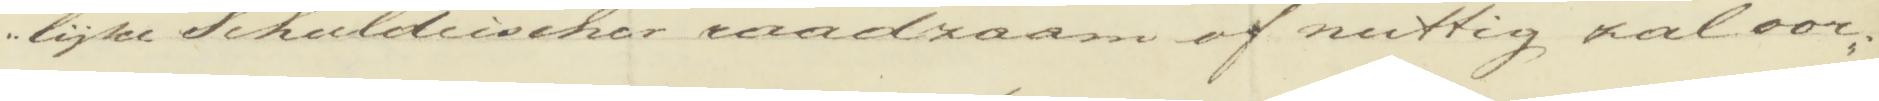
„lijke Schuldeischer raadzaam of nuttig zal oor„
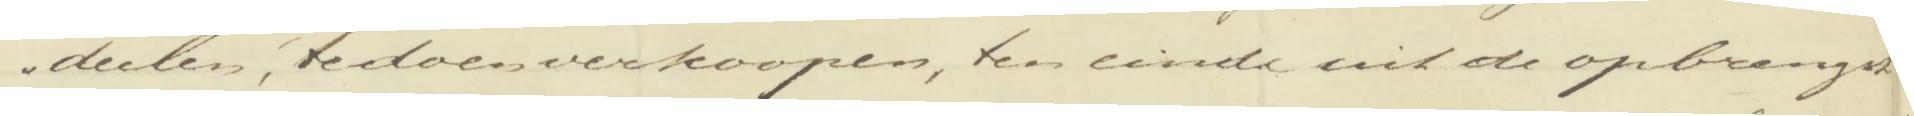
„deelen, te doen verkoopen, ten einde uit de opbrengst
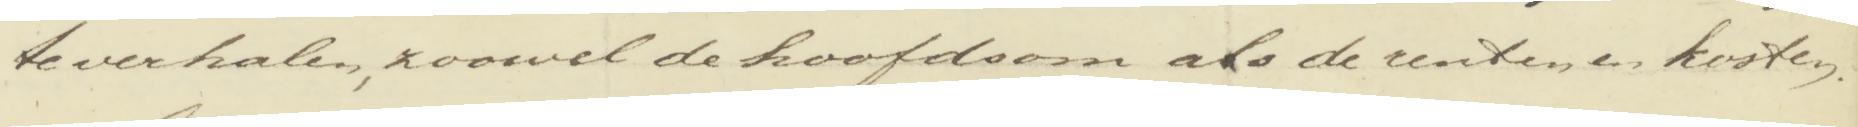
te verhalen, zoowel de hoofdsom als de renten en kosten,
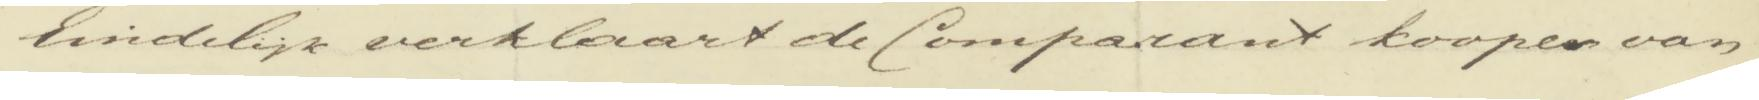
Eindelijk verklaart de Comparant kooper van
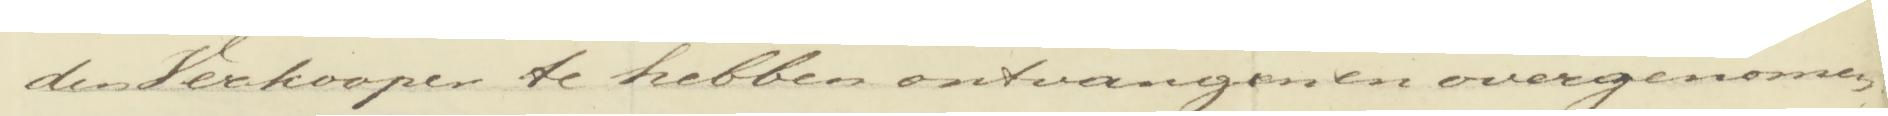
den Verkooper te hebben ontvangen en overgenomen
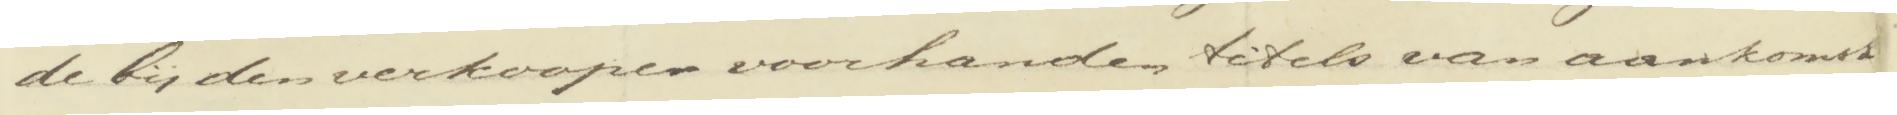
de bij den verkooper voorhanden titels van aankomst
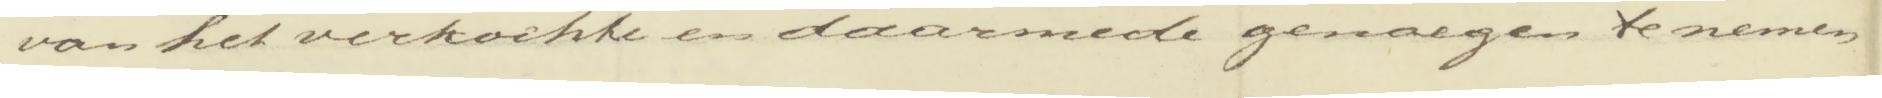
van het verkochte en daarmede genoegen te nemen
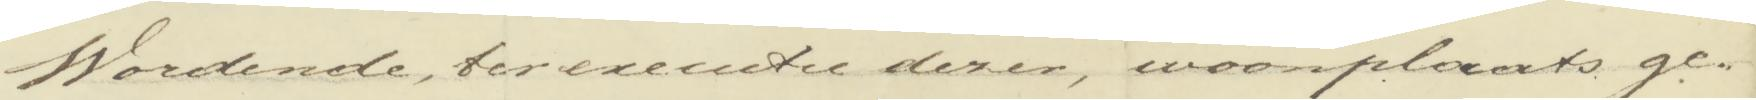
Wordende, ter executie dezer, woonplaats ge„
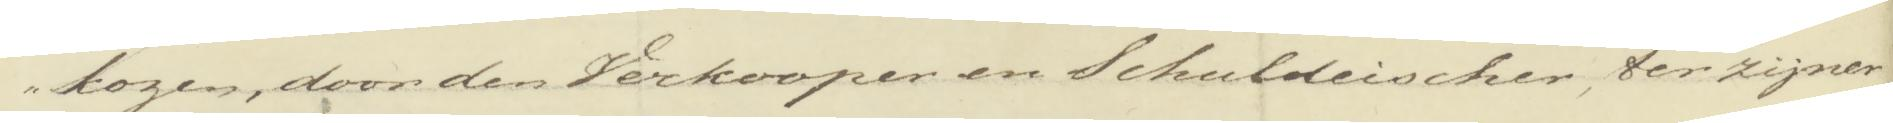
„kozen, door den Verkooper en Schuldeischer ter zijner
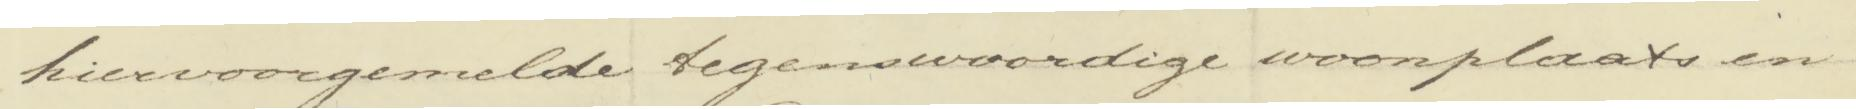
hiervoorgemelde tegenswoordige woonplaats en
